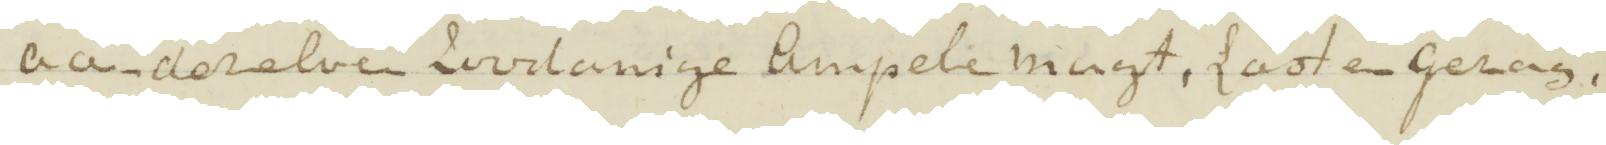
aan dezelve zoodanige Ampele magt, Last en Gezag,
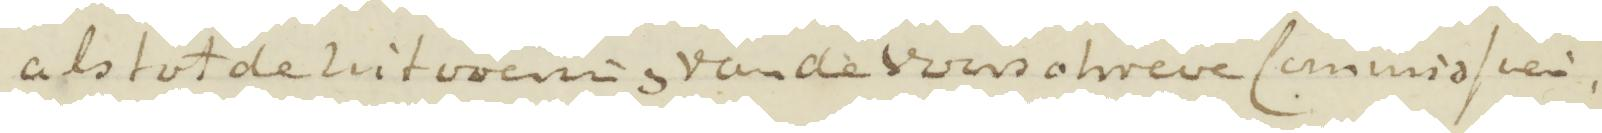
als tot de uitvoering van de voorschreve Commissien,
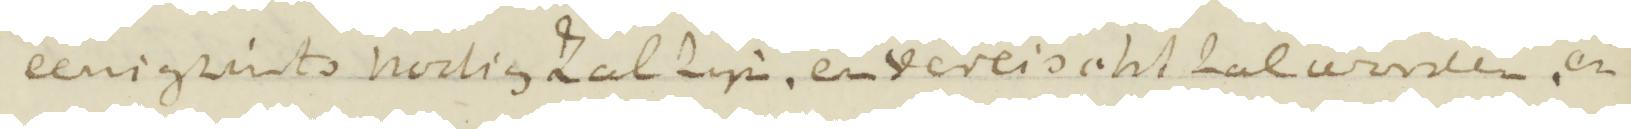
eenigzints nodig zal zijn, en vereischt zal worden, en
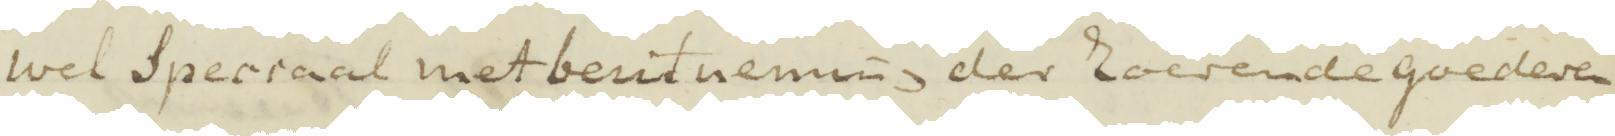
wel speciaal met bezitneming der Roerende goederen
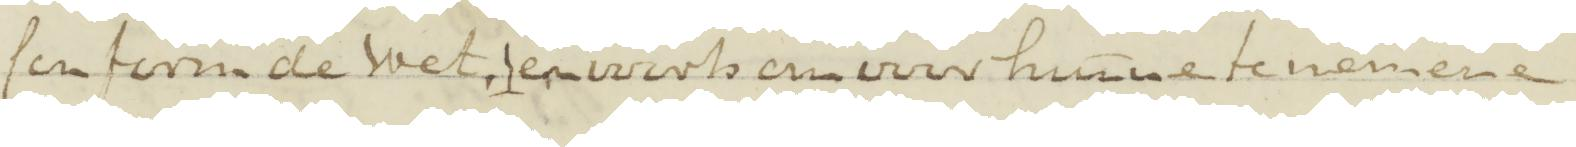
Conform de wet,¶ en voorts om voor hunne te nemene
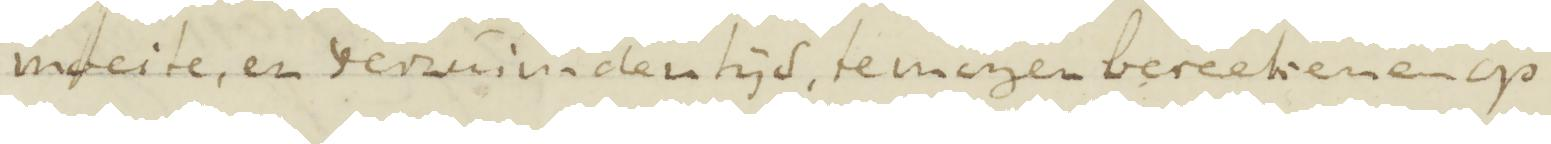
moeite, en verzuimden tijd, te mogen bereekenen op
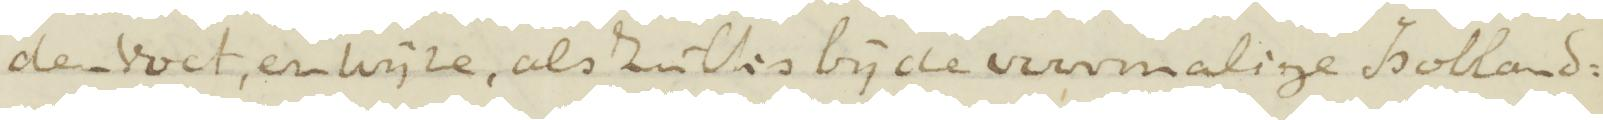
den voet, en wijze, als zulks bij de voormalige Holland=
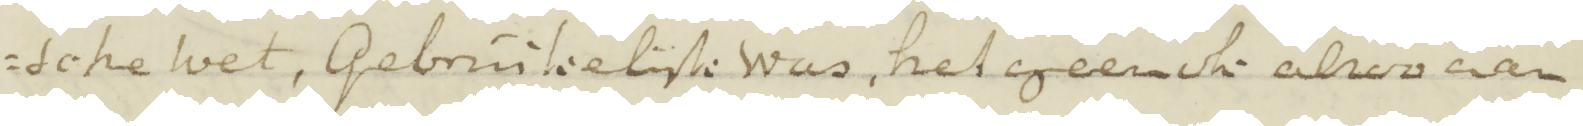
=sche wet, Gebruikelijk was, het geen ik alzoo aan
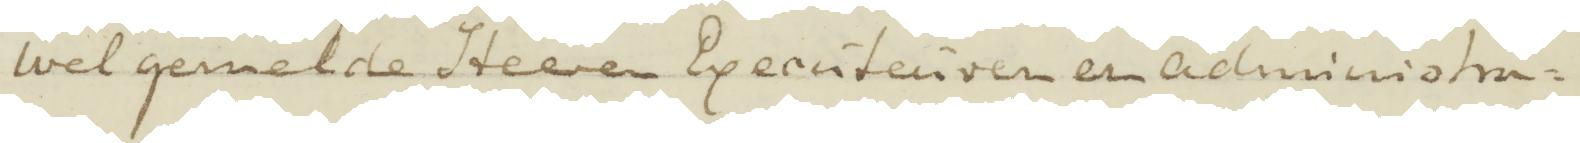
wel gemelde Heeren Executeuren en administra=
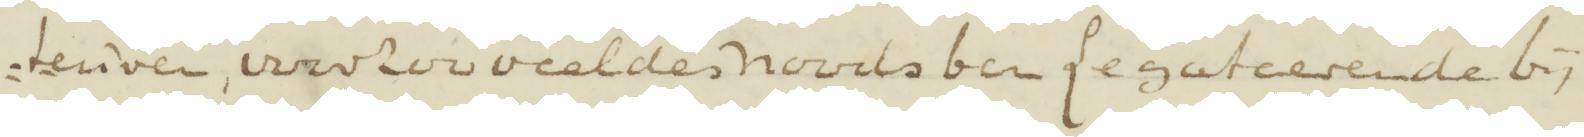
=teuren, voor zoo veel des noods ben Legateerende bij
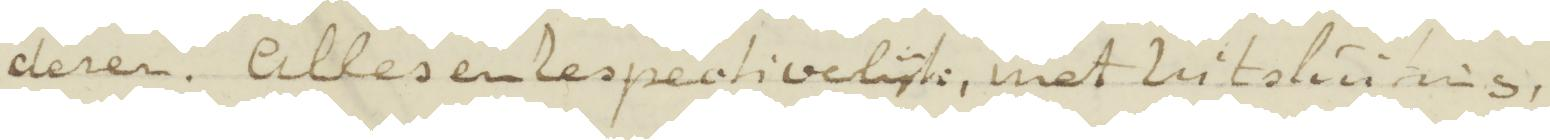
dezen. Alles en respectivelijk, met uitsluiting,
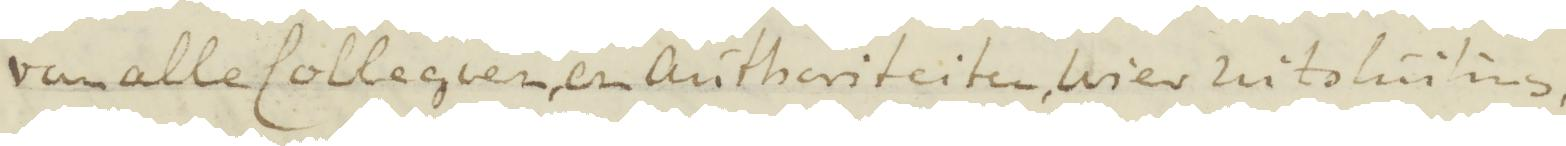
van alle Collegien, en Authoriteiten, wier uitsluiting,
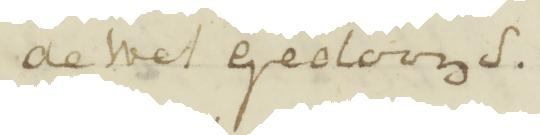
de wet gedoogd.
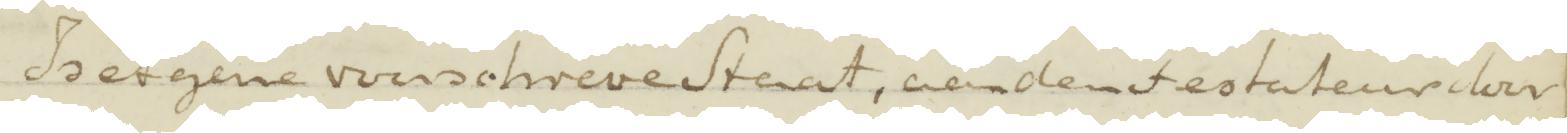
het gene voorschreve staat, aan den Testateur door
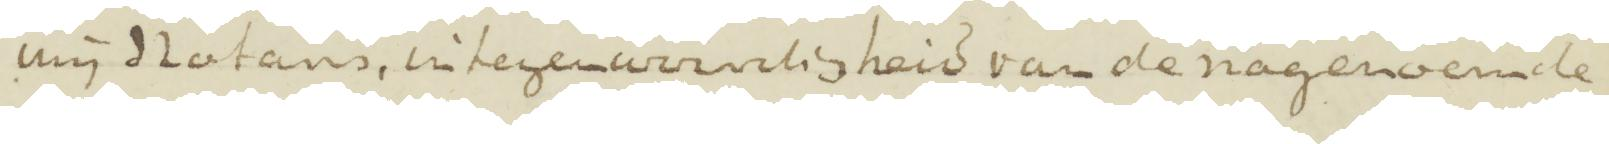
mij Notaris, in tegenwoordigheid van de nagenoemde
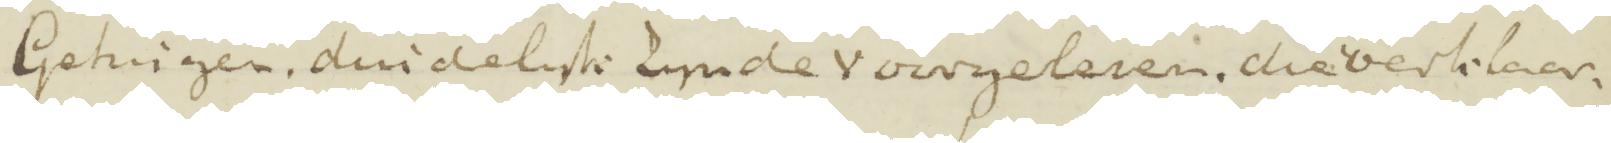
Getuigen, duidelyk zynde voorgelezen, die verklaar„
